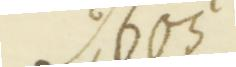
2605
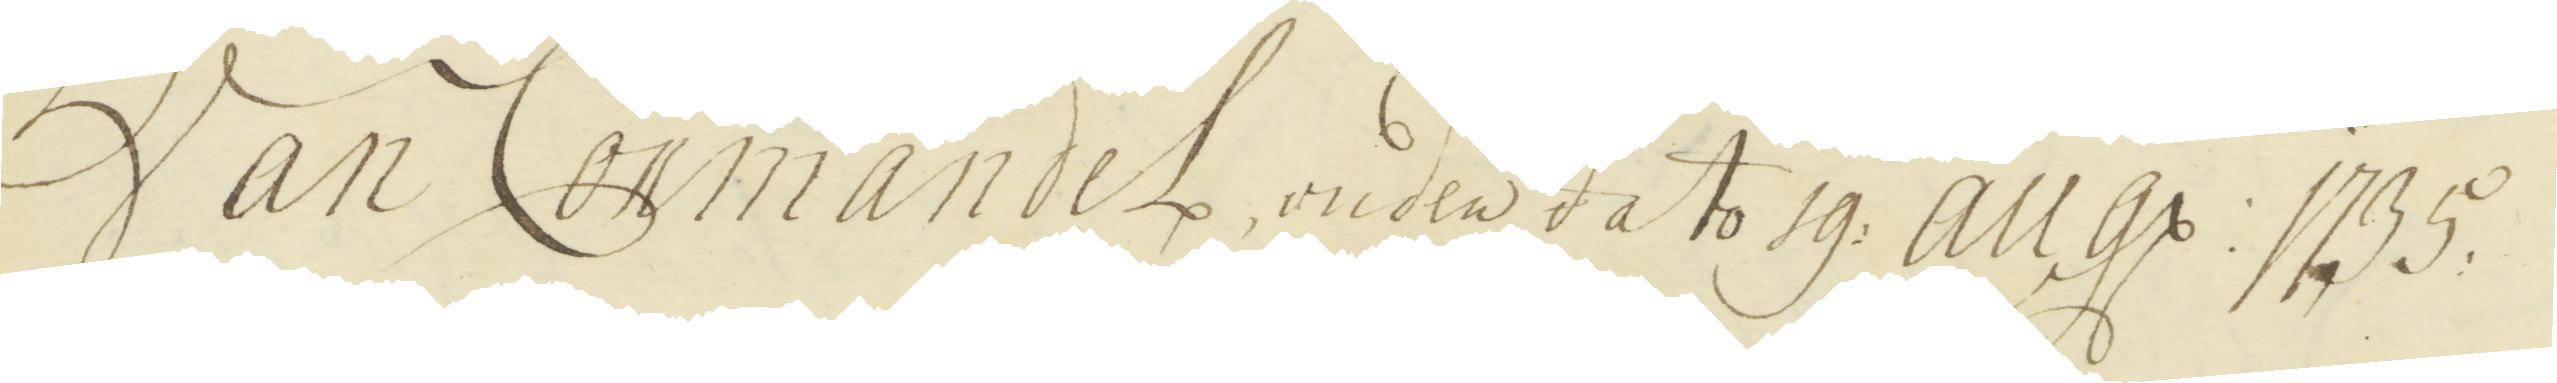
Van Cormandel, onder dato 19: augx: 1735.
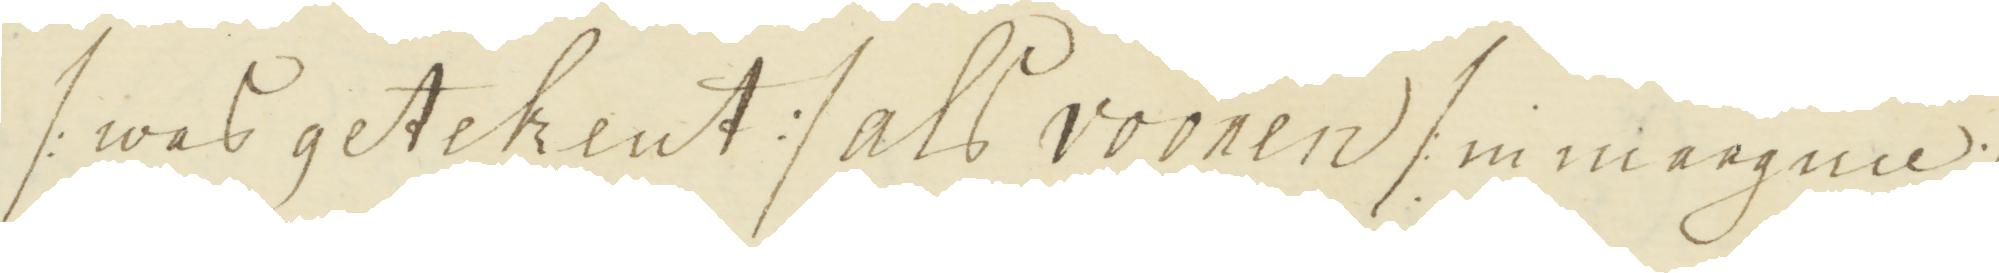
/:was getekent:/ als vooren /:in margine:/
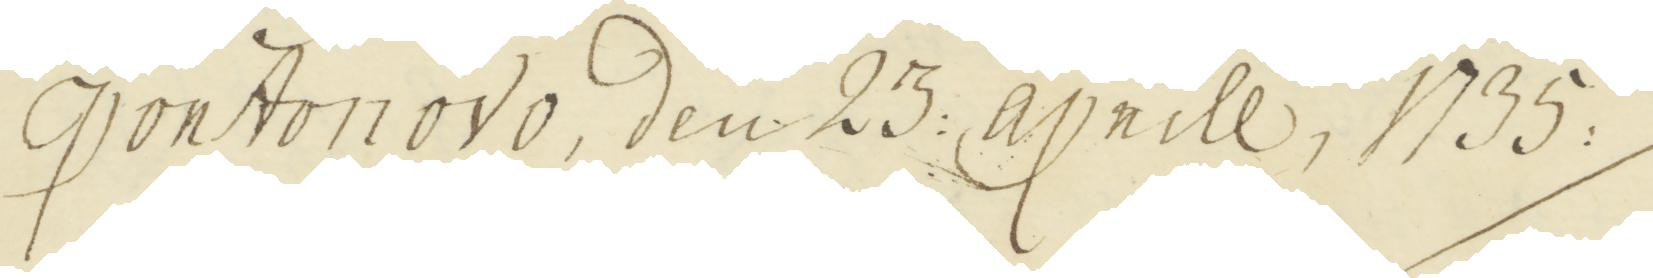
portonovo, den 23: aprile, 1735:
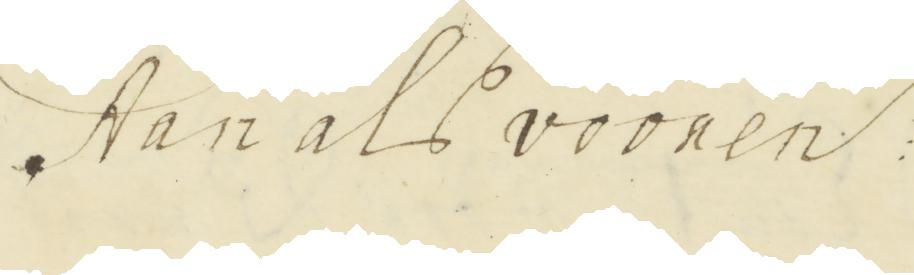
Aan als vooren:
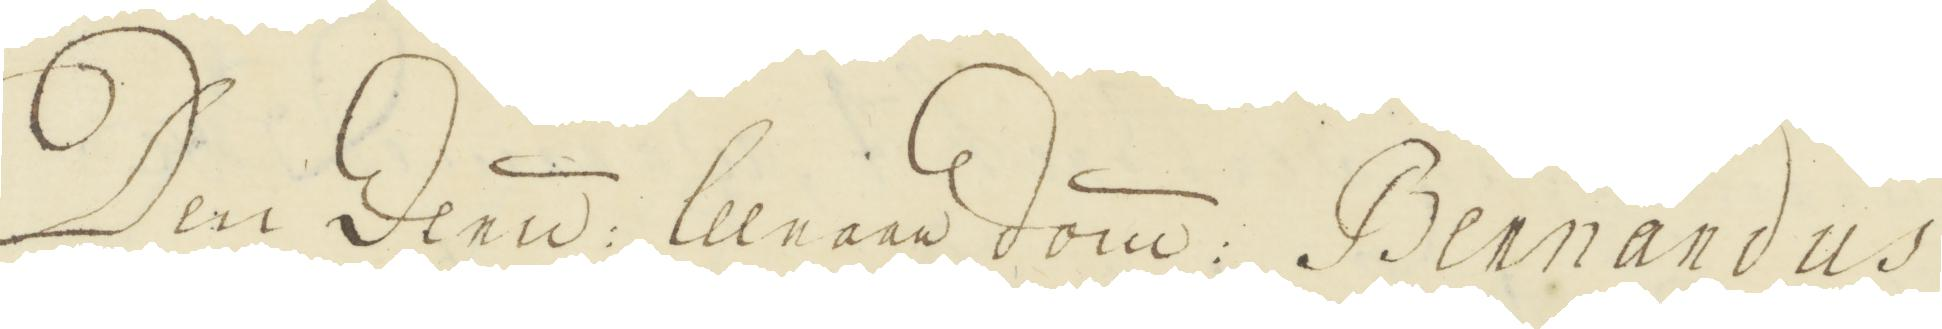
Den Eerw: leeraar dom: Bernardus
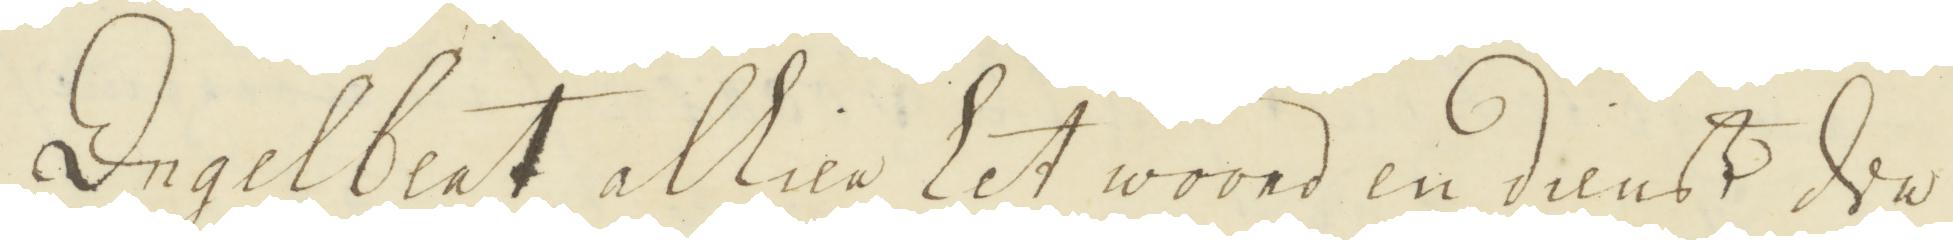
Engelbert alhier het woord en dienst der
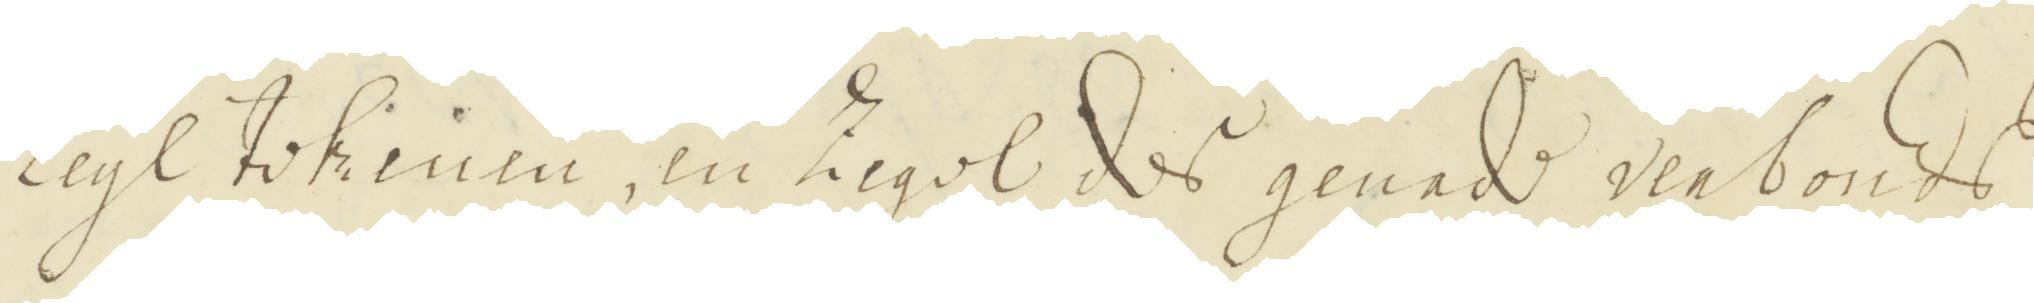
heijl tekenen, en zegel des genade verbonds
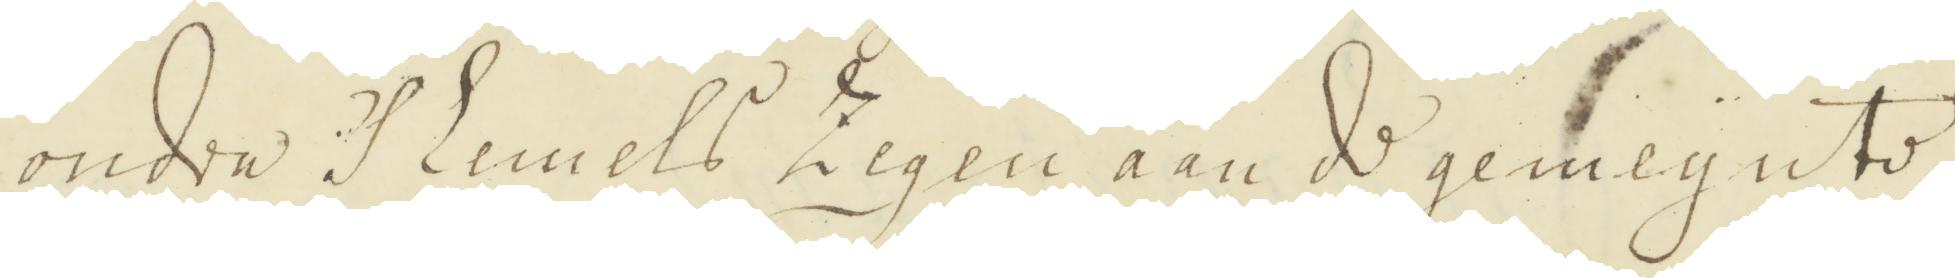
onder 's hemels zegen aan de gemeijnte
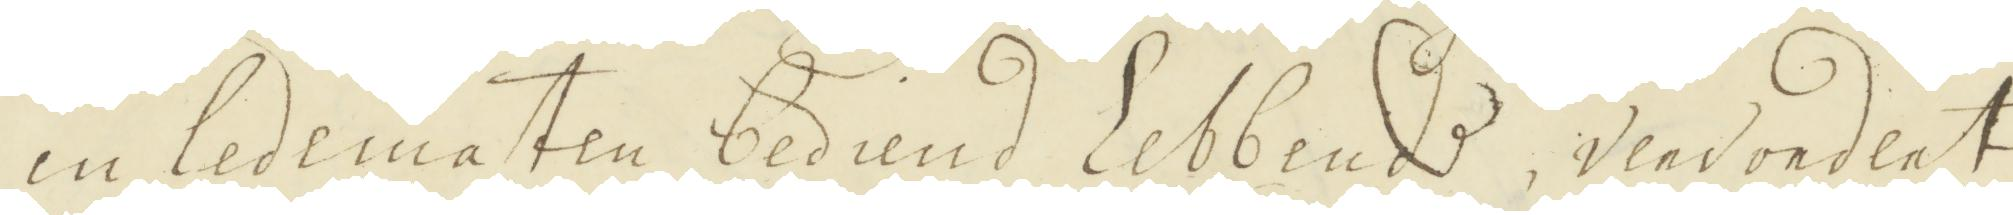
en ledematen bediend hebbende, vervordert
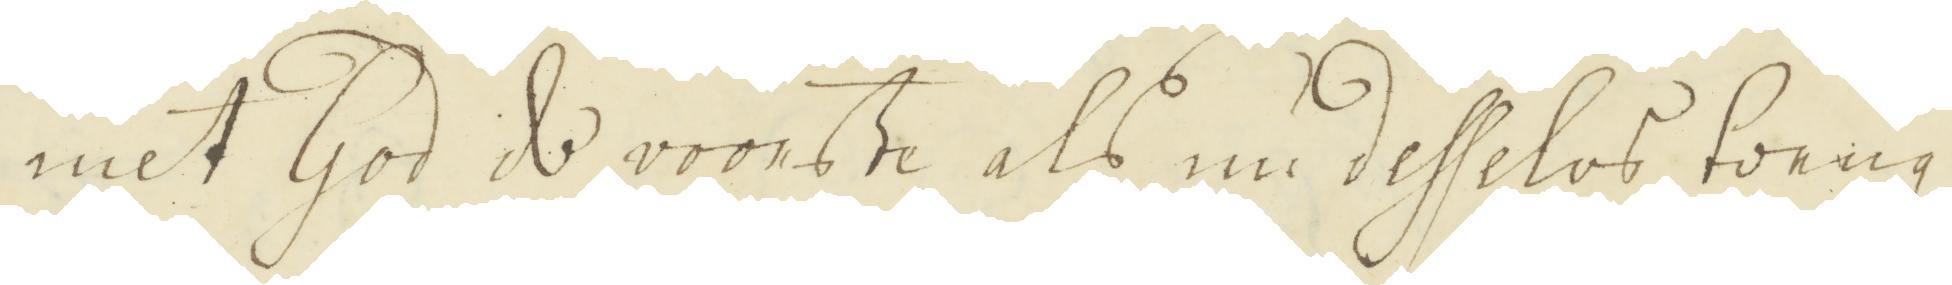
met God de voorste als nu desselvs terug
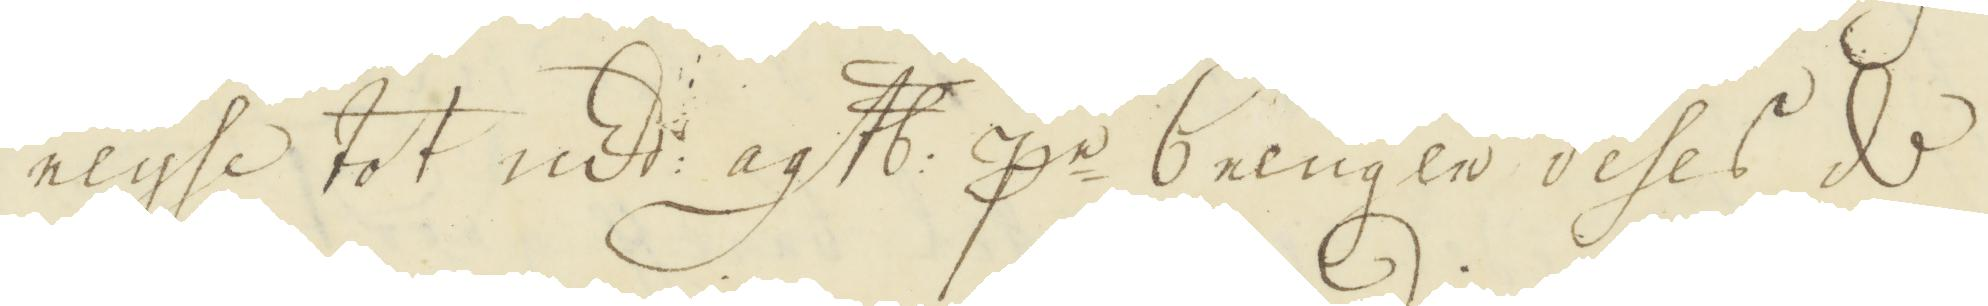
reijse tot uEd: agtb: p=r brenger deses de
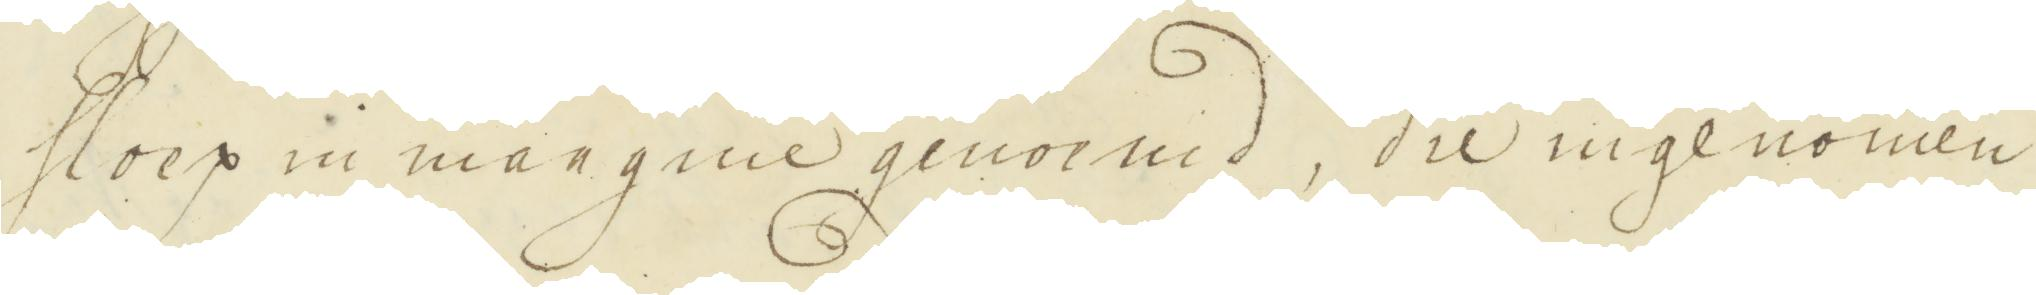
sloep in margine genoemd, die ingenomen
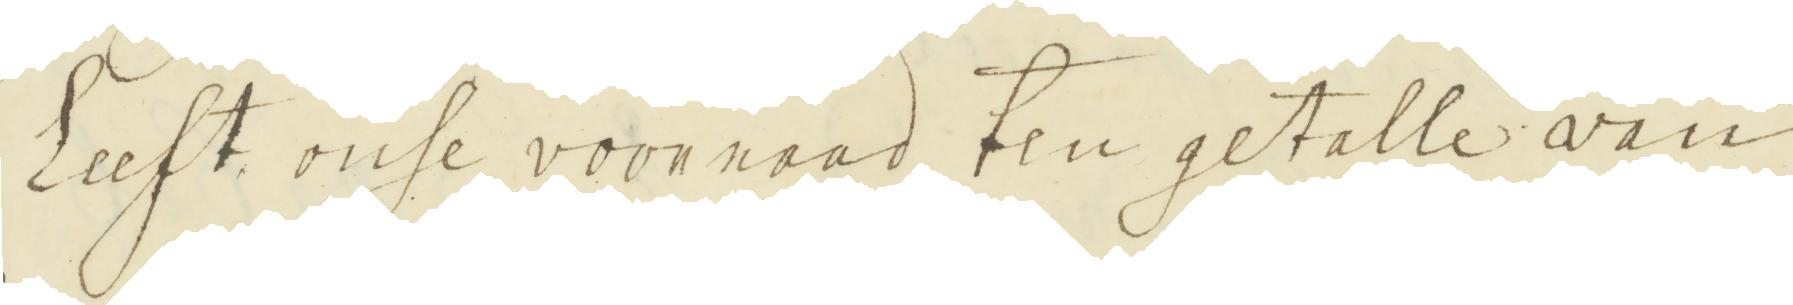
heeft onse voorraad ten getalle van
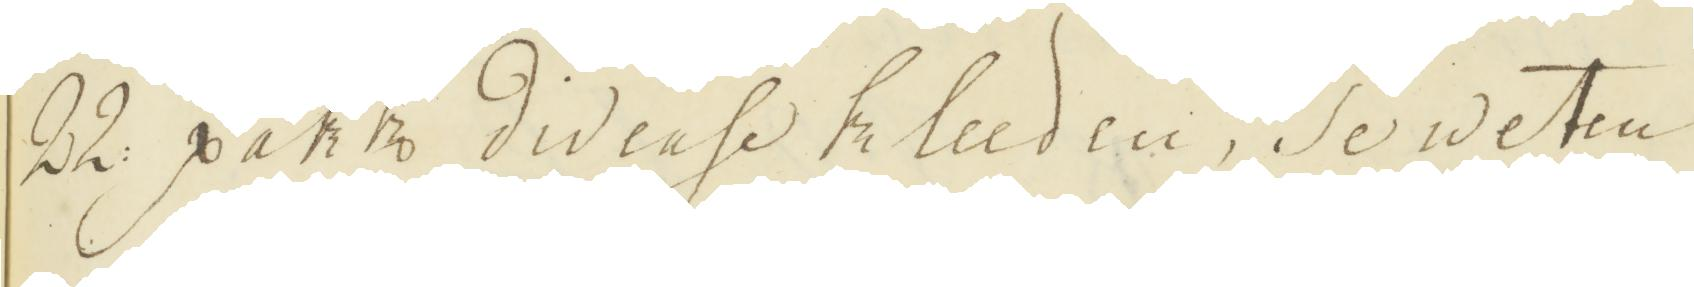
22: pakk diverse kleeden, te weten
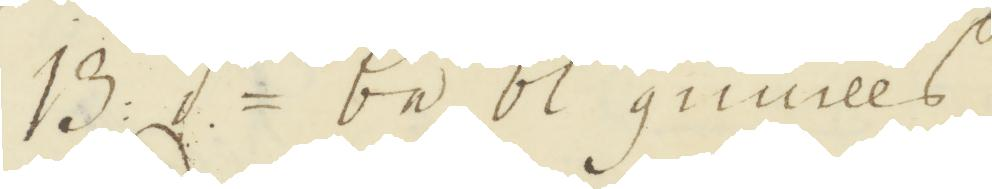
13: d=m br bl guinees
